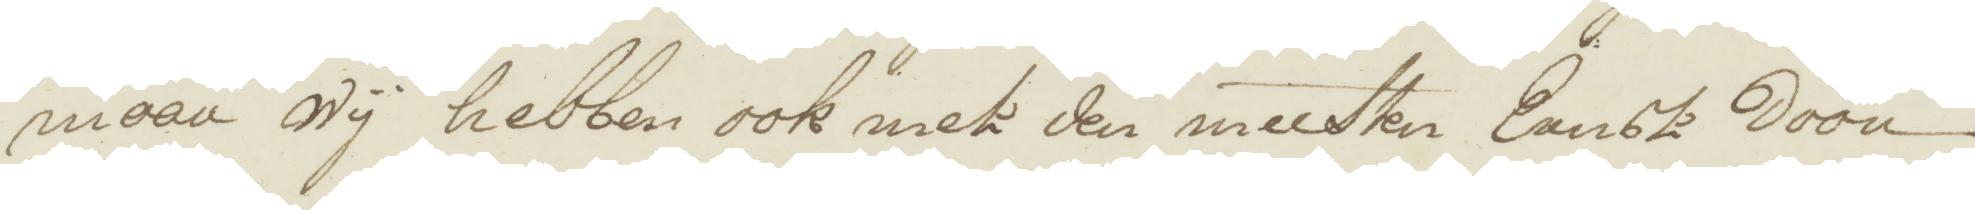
maar wij hebben ook met den meesten Ernst door
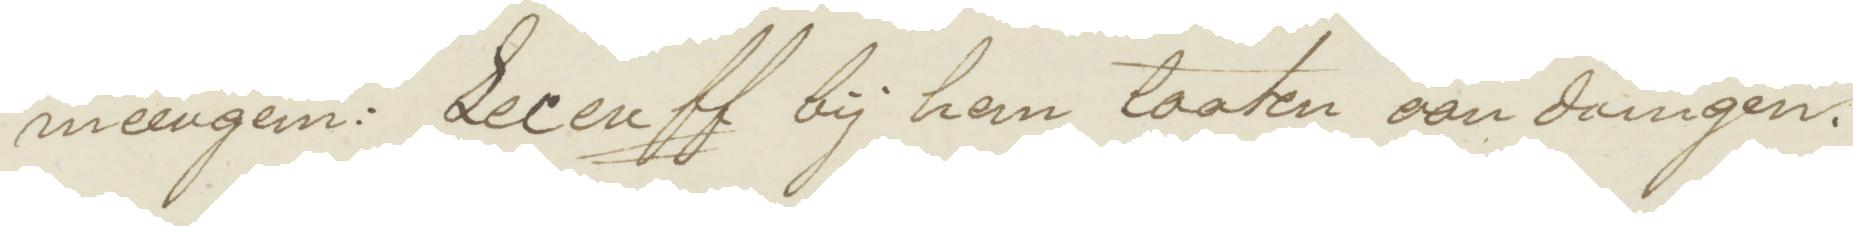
meergem: Lecerff bij hem laaten aan dringen.
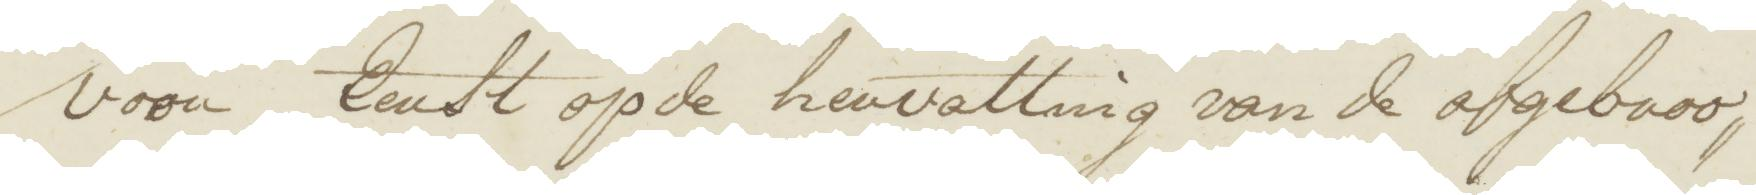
Voor Eerst op de hervatting van de afgebroo„
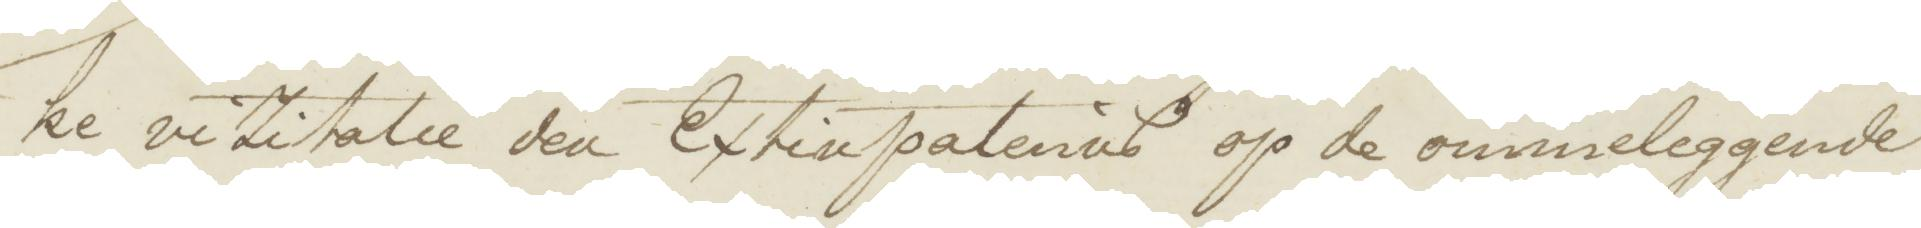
ke vizitatie der Extirpateurs op de ommeleggende
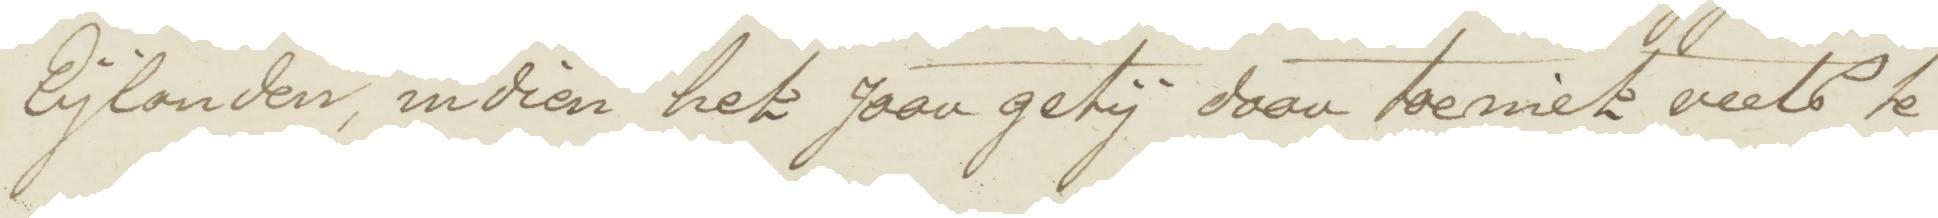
Eijlanden, in dien het Jaar getij daar toe niet veels te
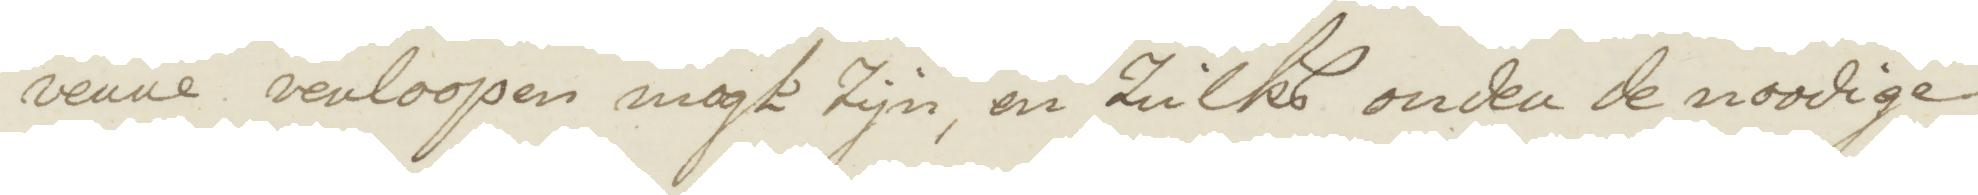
verre verloopen mogt zijn, en zulks onder de noodige
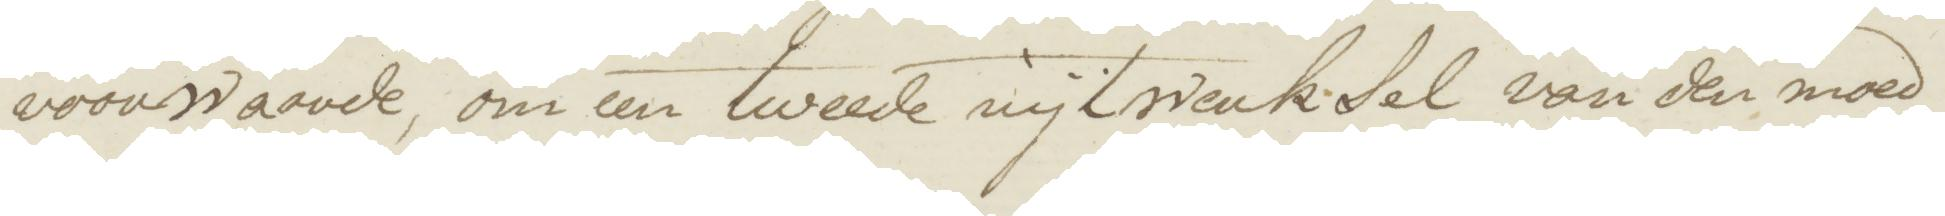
voorwaarde, om een tweede uijtwerksel van den moed„
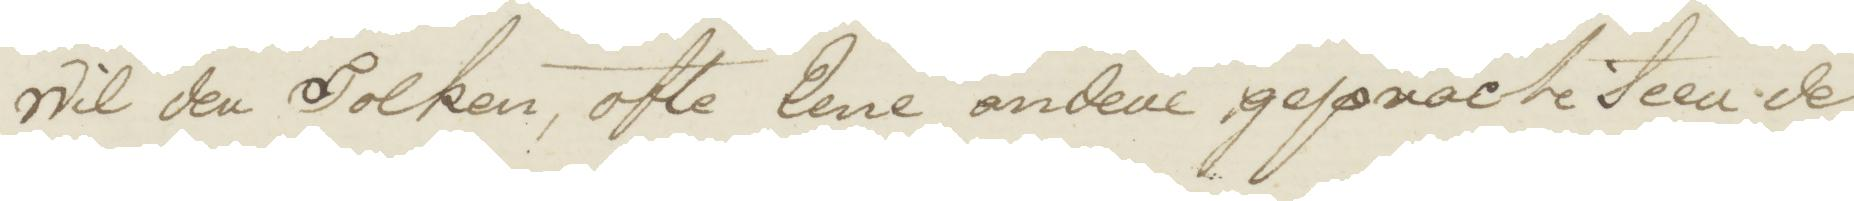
wil den Tolken, ofte Eene andere „gepractiseer de
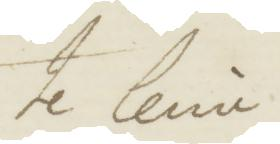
te lemi
